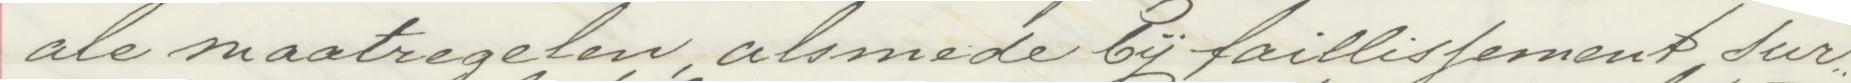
ale maatregelen alsmede bij faillissement, sur„
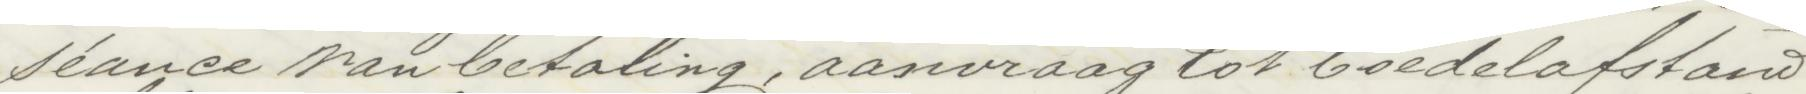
séance van betaling, aanvraag tot boedelafstand
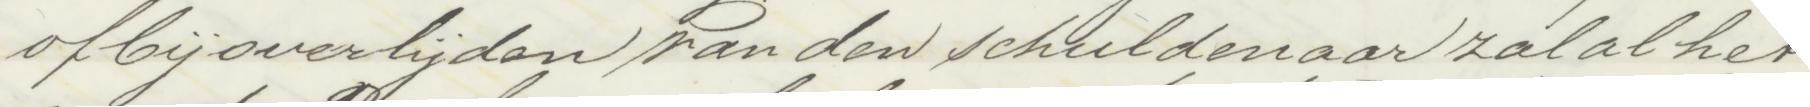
of bij overlijden van den schuldenaar zal al het
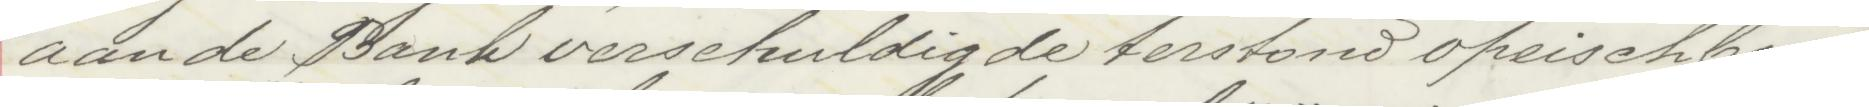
aan de Bank verschuldigde terstond opeischbaar
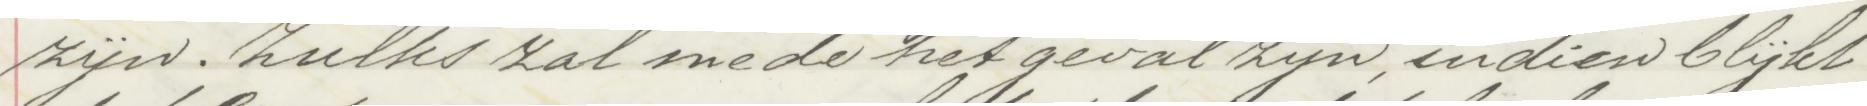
zijn. Zulks zal mede het geval zijn, indien blijkt
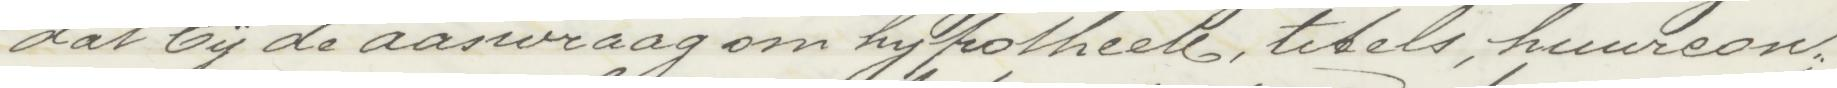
dat bij de aanvraag om hypotheek, titels, huurcon„
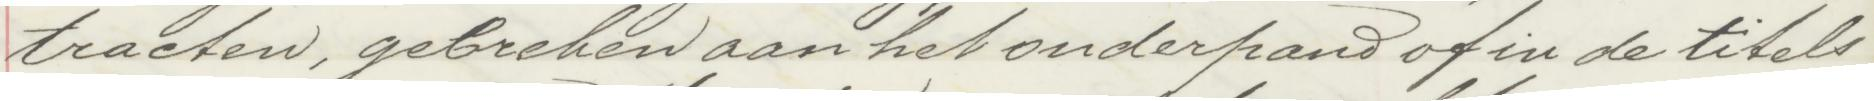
tracten, gebreken aan het onderpand of in de titels,
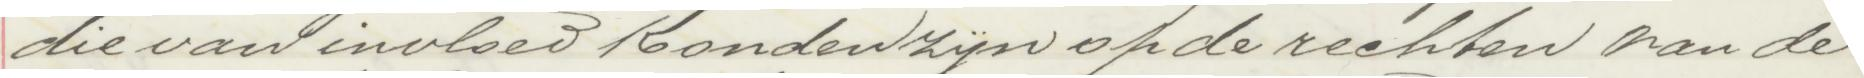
die van invloed konden zijn op de rechten van de
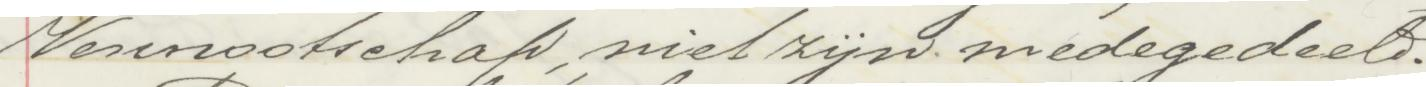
Vennootschap, niet zijn medegedeeld.
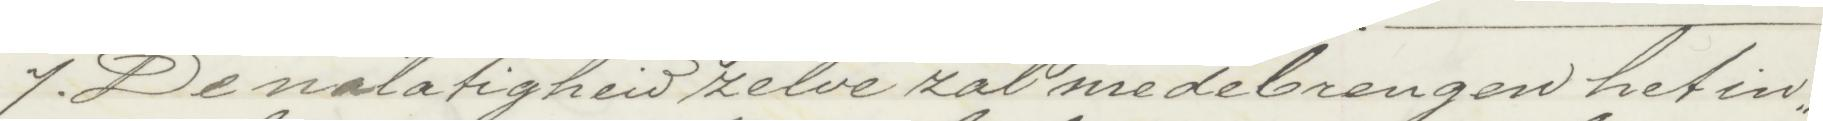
7. De nalatigheid zelve zal medebrengen het in„
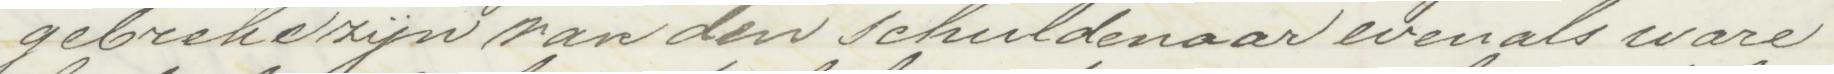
gebreke zijn van den schuldenaar even als ware
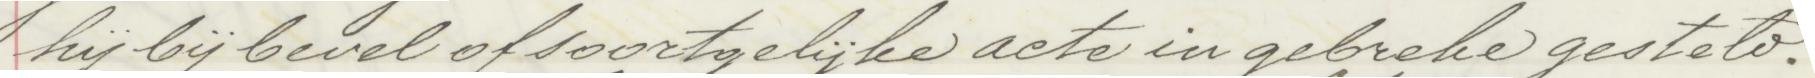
hij bij bevel of soortgelijke acte in gebreke gesteld.
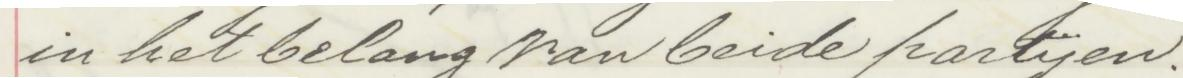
in het belang van beide partijen.
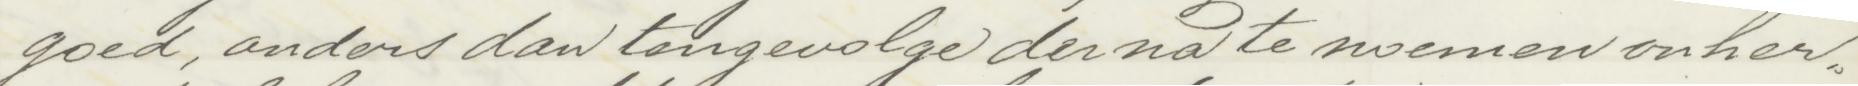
goed, anders dan tengevolge der na te noemen onher„
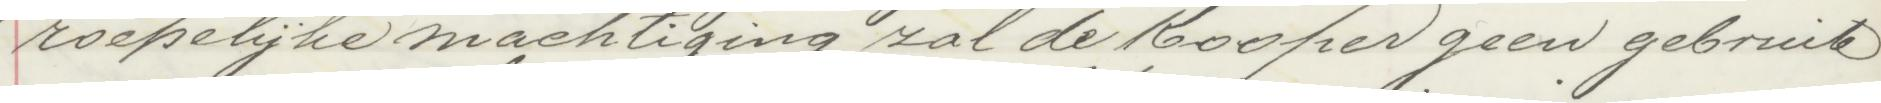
roepelijke machtiging zal de kooper geen gebruik
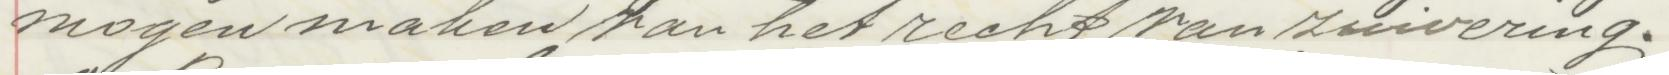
mogen maken van het recht van zuivering.
